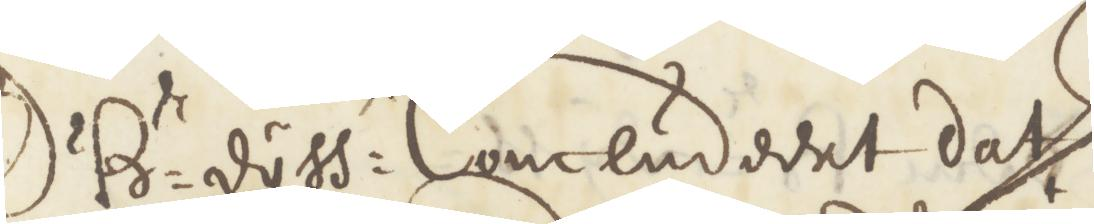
D' h=r eijss=r Concludeert dat
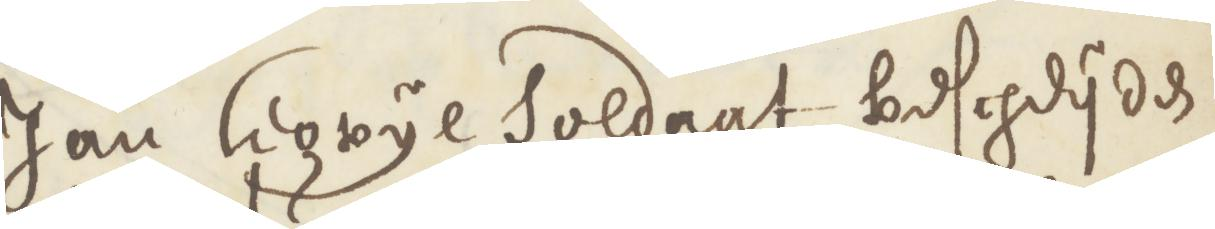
Jan teo vijl soldaat bescheijden
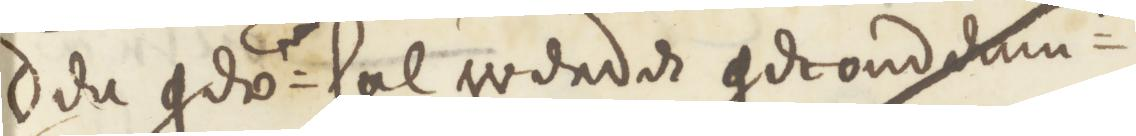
den gev=e sal werden gecondemn=t
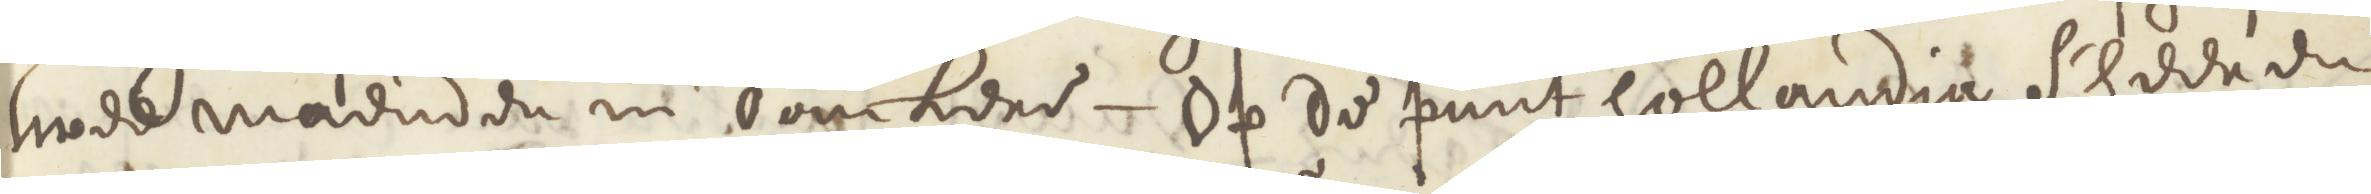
twee maenden in donckere — Op de punt hollandia s'heeren
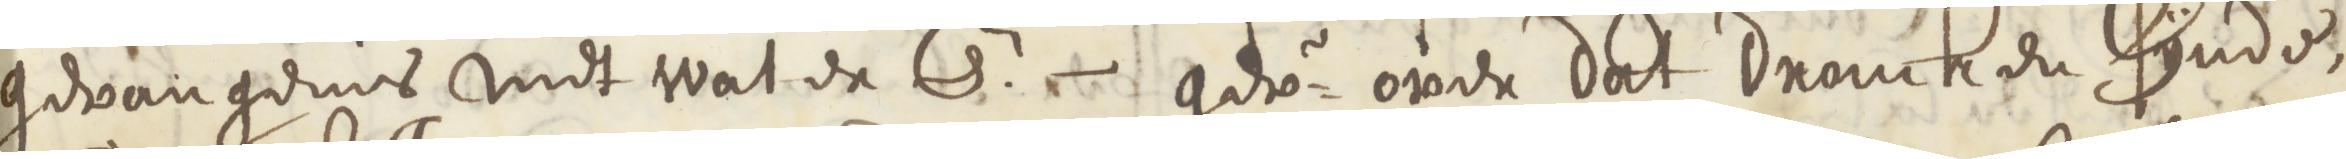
gevangenis met wat er ende — gev=e over dat droncken sijnde„
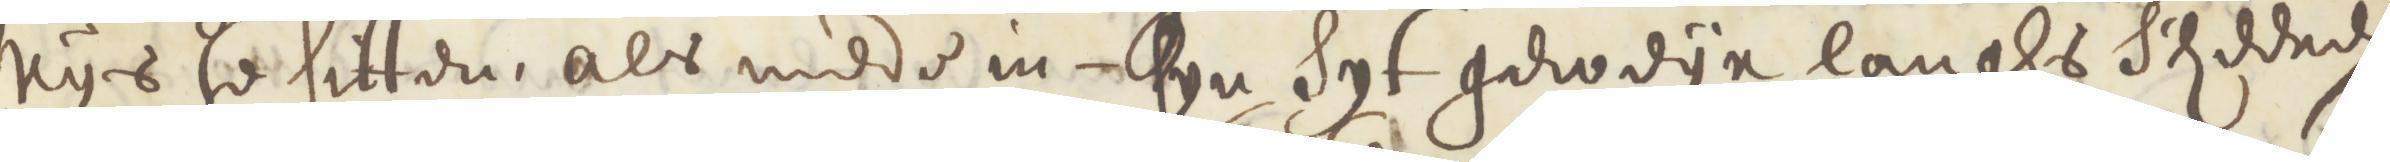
rijs te sitten, als mede in — syn syf geweijr langhs s'heeren
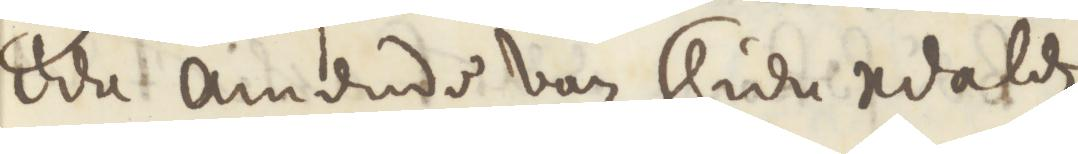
een amende van tsien reale
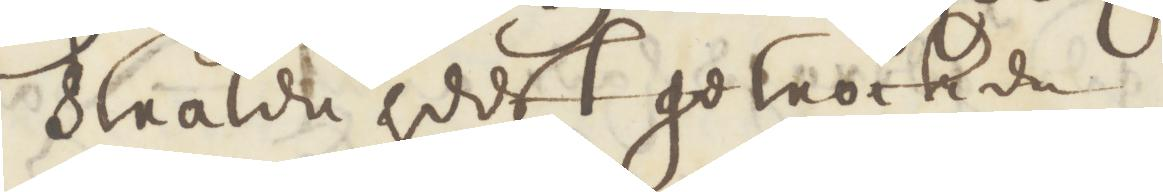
straten heeft getrocken
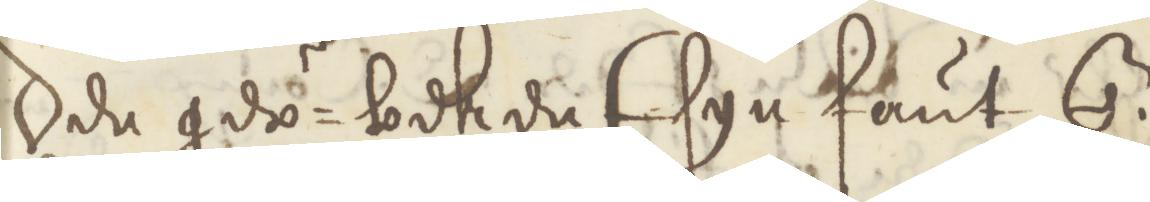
den gev:' bekent syn faut ende
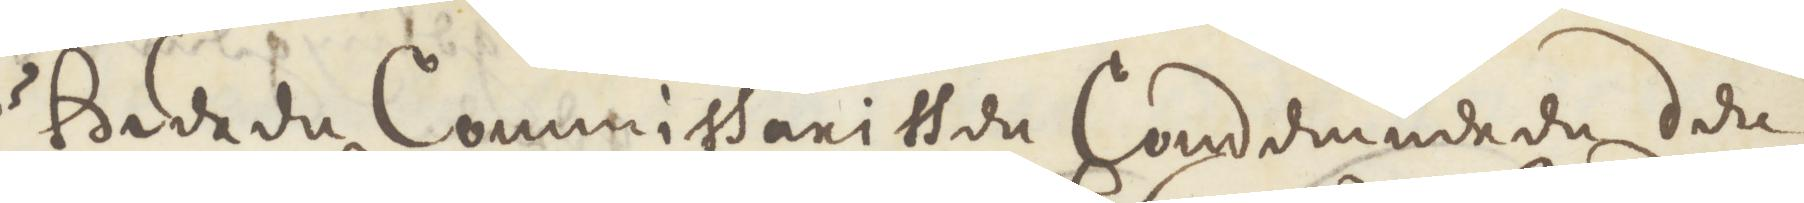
D'Heeren Commissarissen Condemneren den
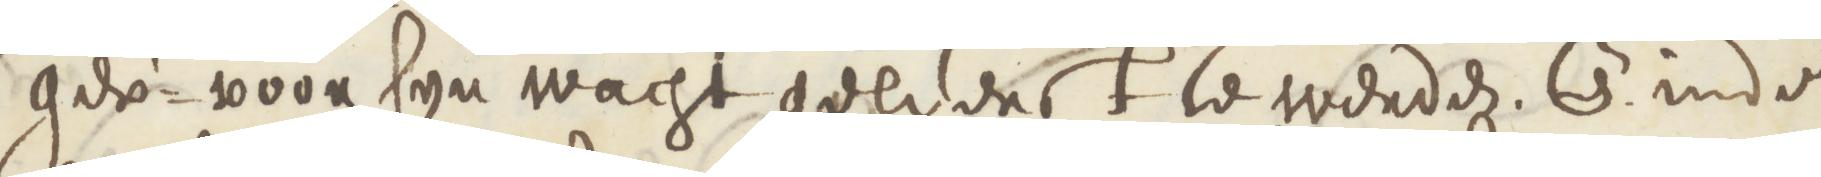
gev=e voor syn wagt geleerst te werden. ende. inde
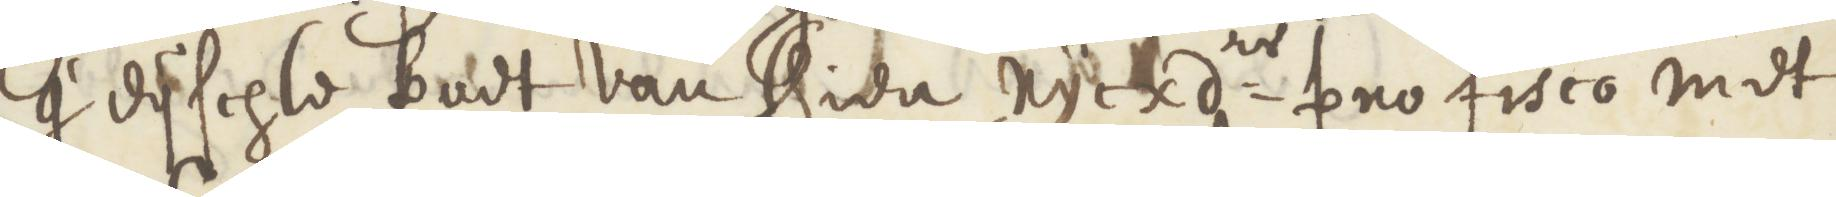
g’eijschte boet van thien rijckd=rs pro fisco met
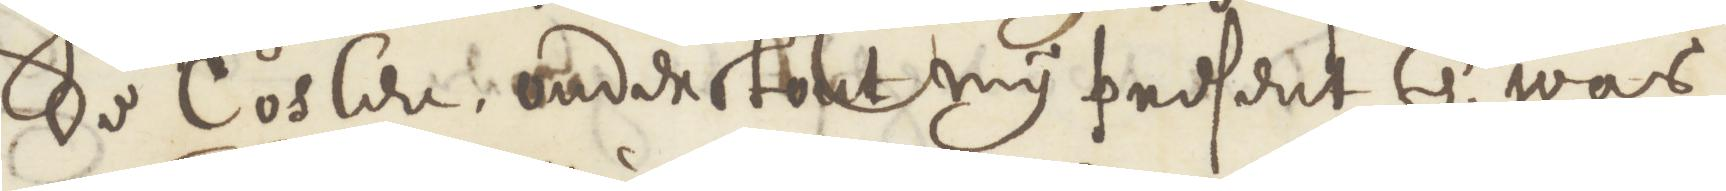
de Costen, onderstont mij present ende. was
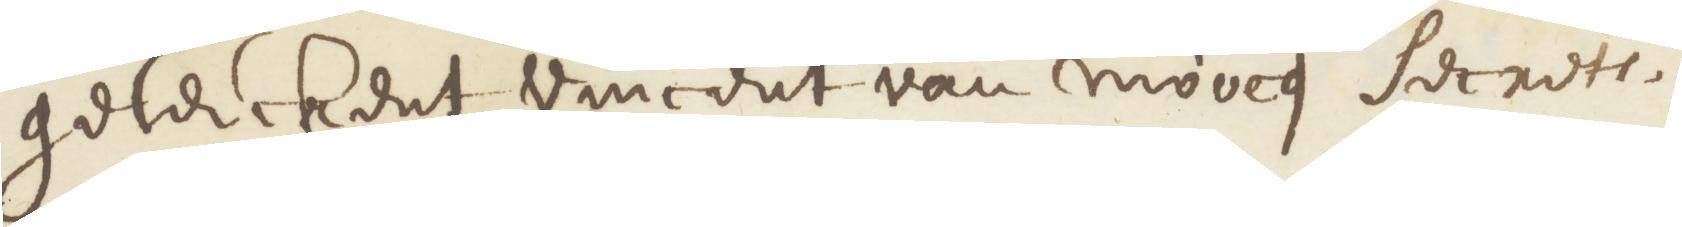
geteeckent vincent van moocq secrets.
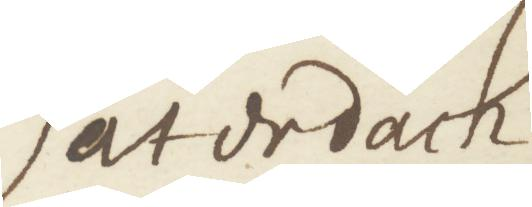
saterdach
